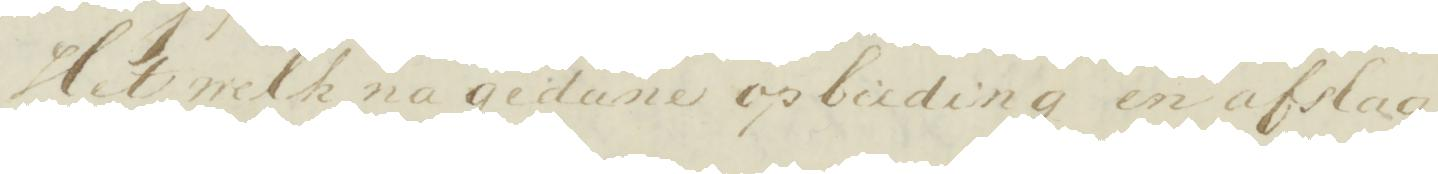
Het welk na gedane opbieding en afslag
